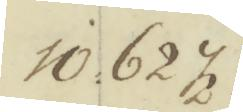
10„62½
